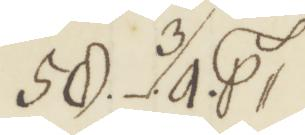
58. ¾ p:s „
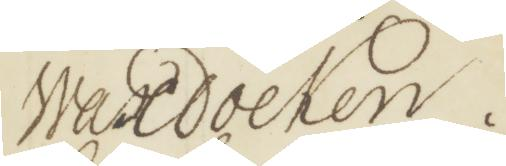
Waxdoeken.
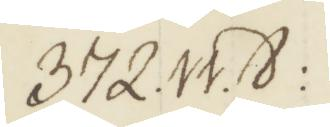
372.11.8:
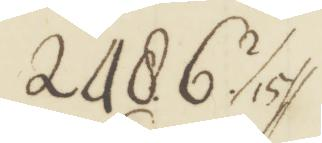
248.6 2/15 „
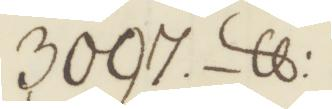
3097.-lb:
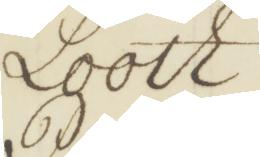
Looth
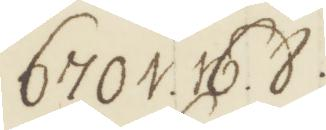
6701.16.8.
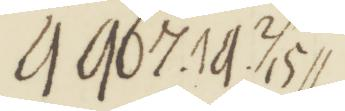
4467:14 2/15 „
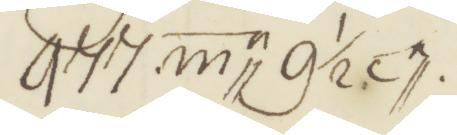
477. m„r 9 ½ c:r „
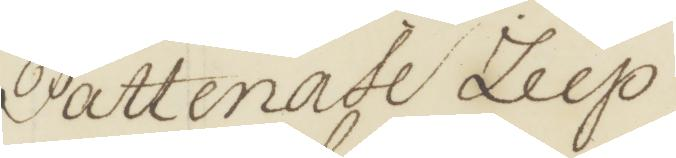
Pattenase Zeep
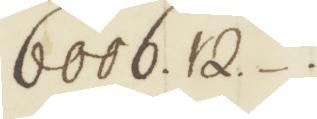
6006.12.-.
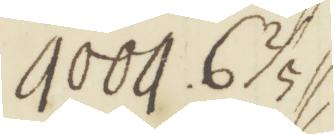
4004.6 2/5 „
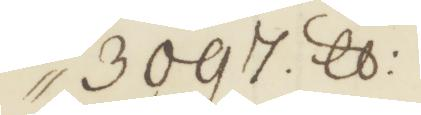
„ 3097. lb:
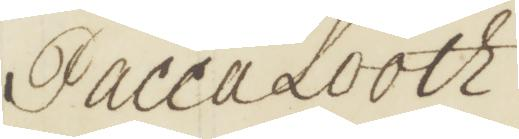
Pacca Looth
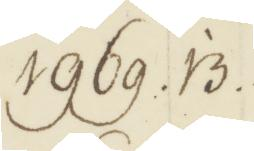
1969.13.
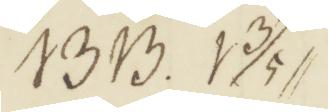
1313. 1 3/5 „
